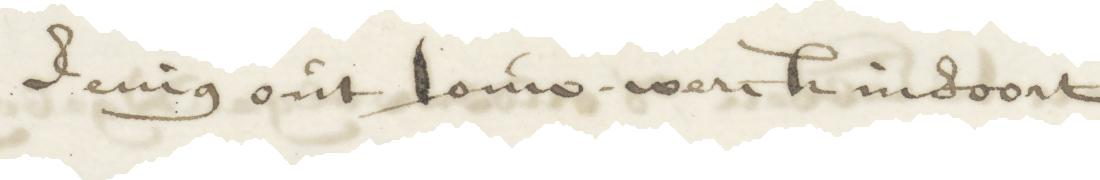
—. —. Eenig out touw-werck insoort
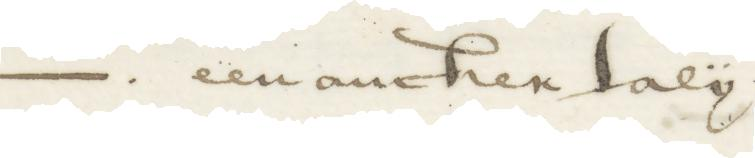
1.—-. een ancker talij
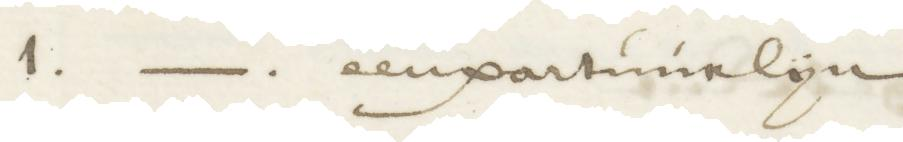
1. —. een partuur lijn
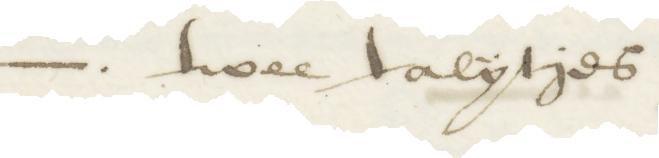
—. twee talijtjes
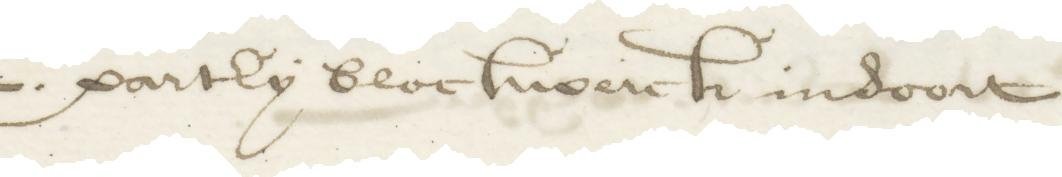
—.—. parthij blockwerck insoort
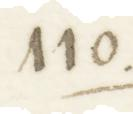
110.
